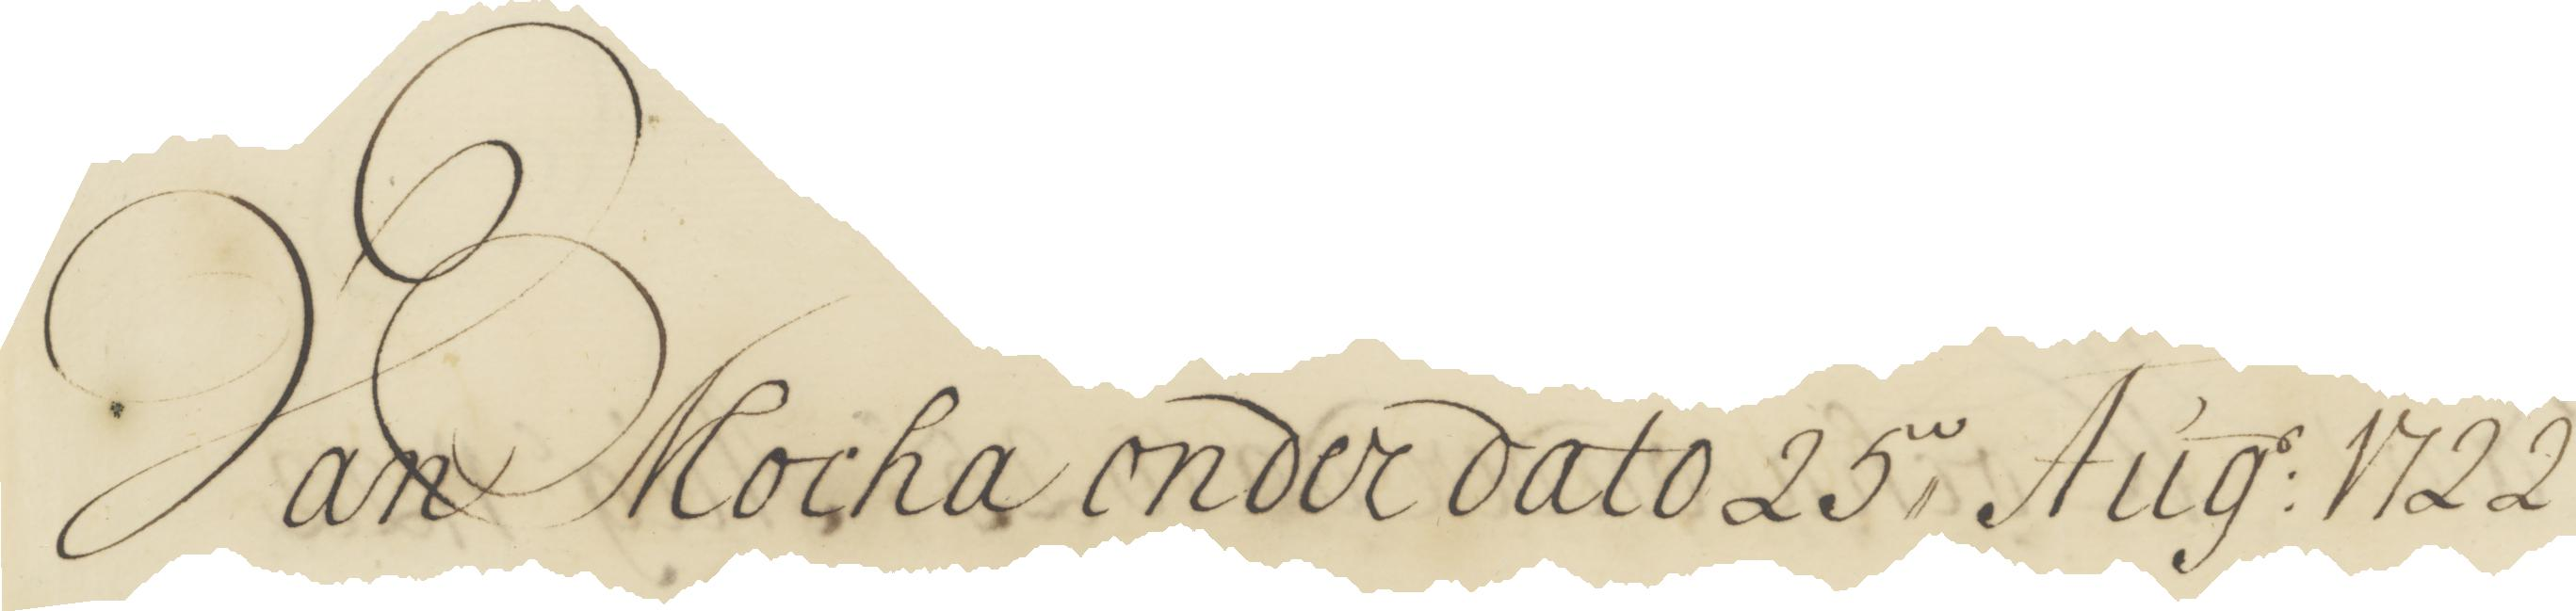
Van Mocha onder dato 25„e Aug:s 1722
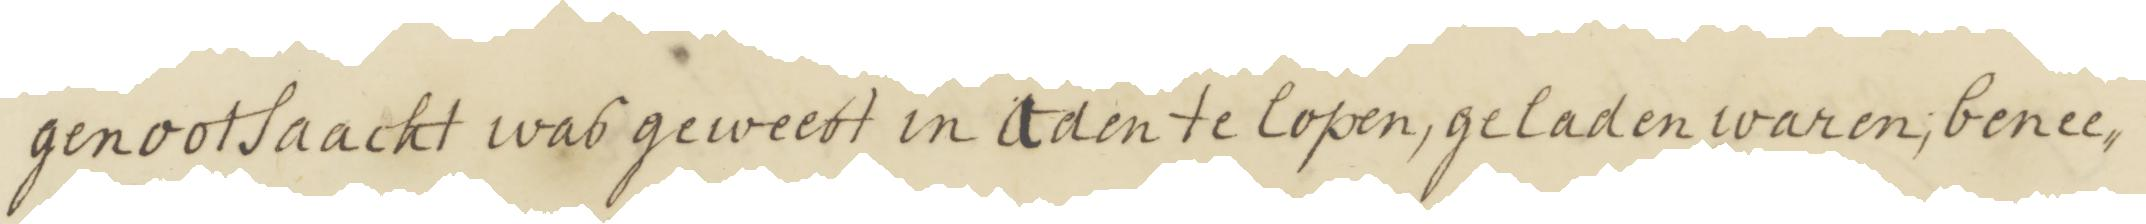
genootsaackt was geweest in aden te lopen, geladen waren; benee„
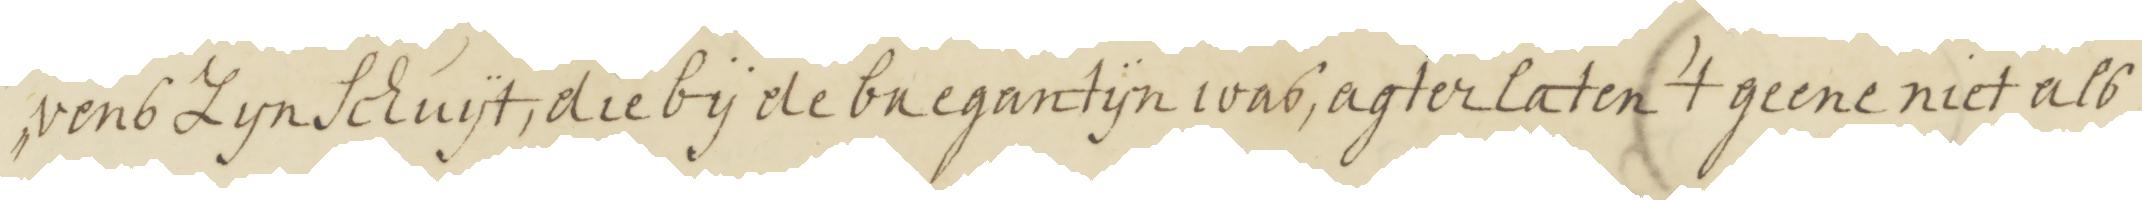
„vens zyn schuijt, die bij de bregantijn was, agterlaten ’t geene niet als
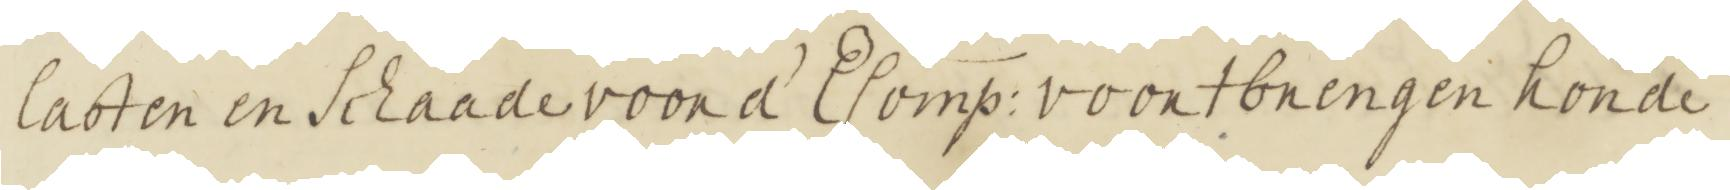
lasten en schaade voor d' EComp: voortbrengen konde
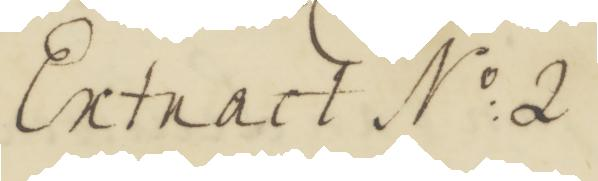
Extract N:o 2
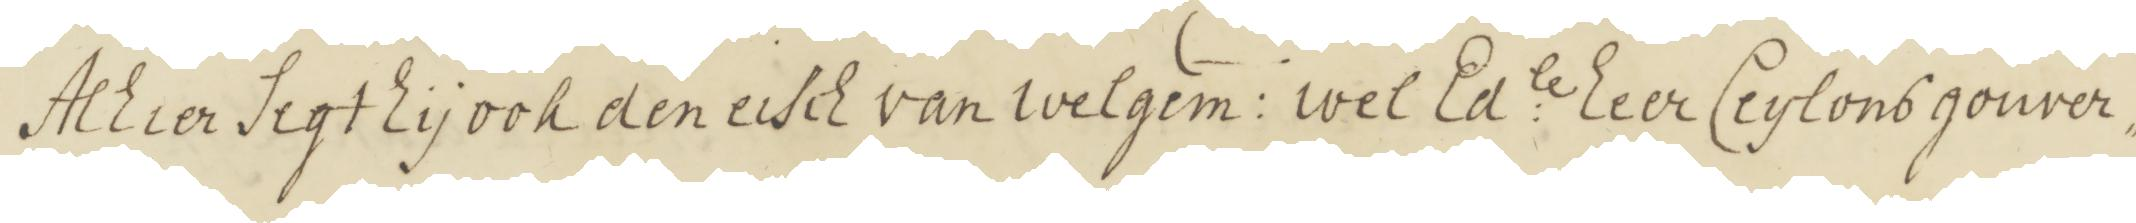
Alhier segt hij ook den eisch van welgem: wel Ed:le heer Ceylons gouver„
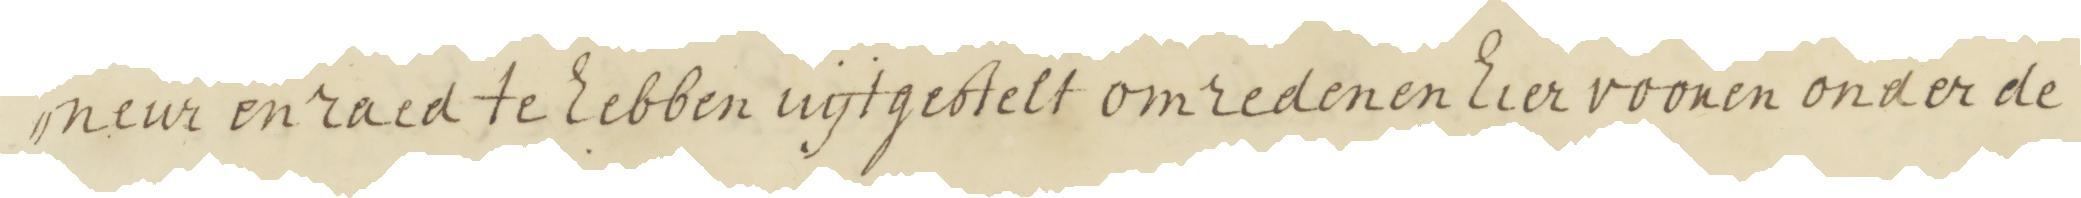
„neur en raed te hebben uijtgestelt om reden en hier vooren onder de
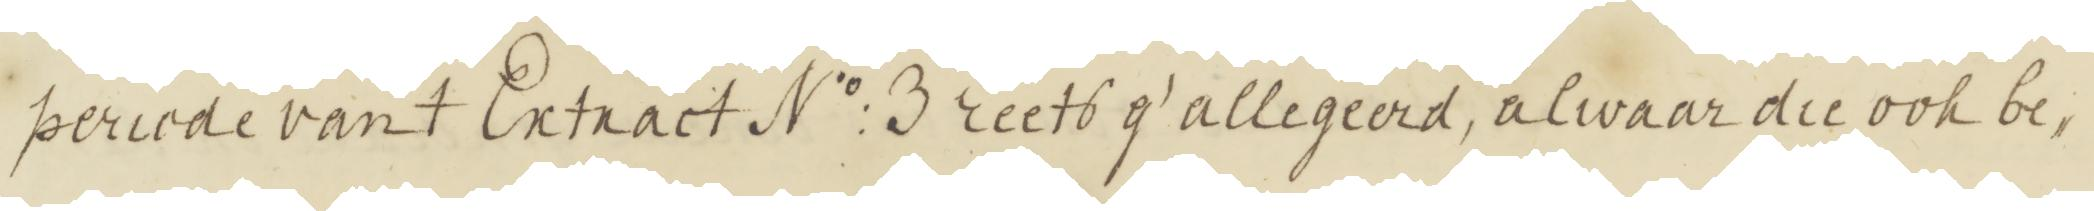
periode van ’t Extract N:o 3 reets g’allegeerd, alwaar die ook be„
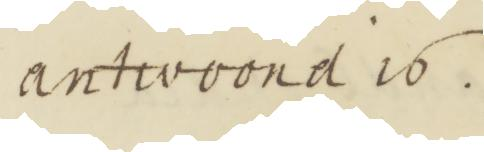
antwoord is.
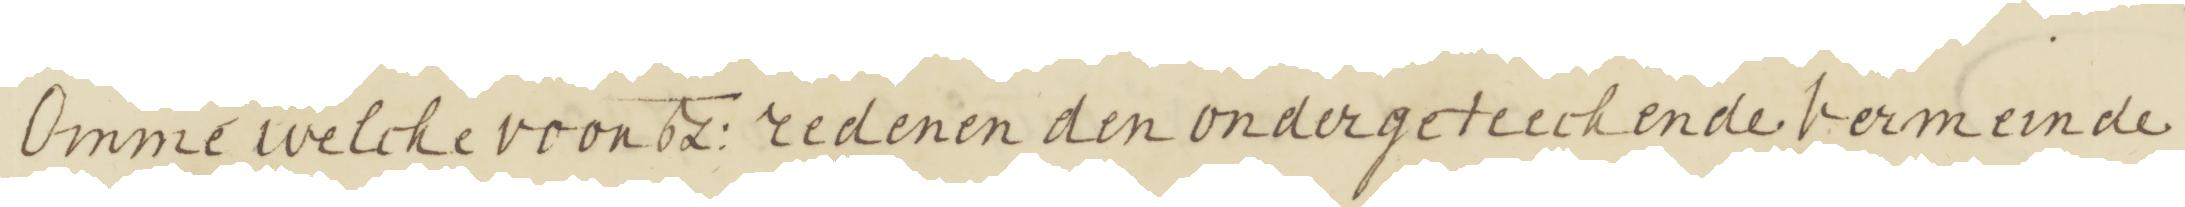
Omme welcke voorsz: redenen den ondergeteeckende vermeinde
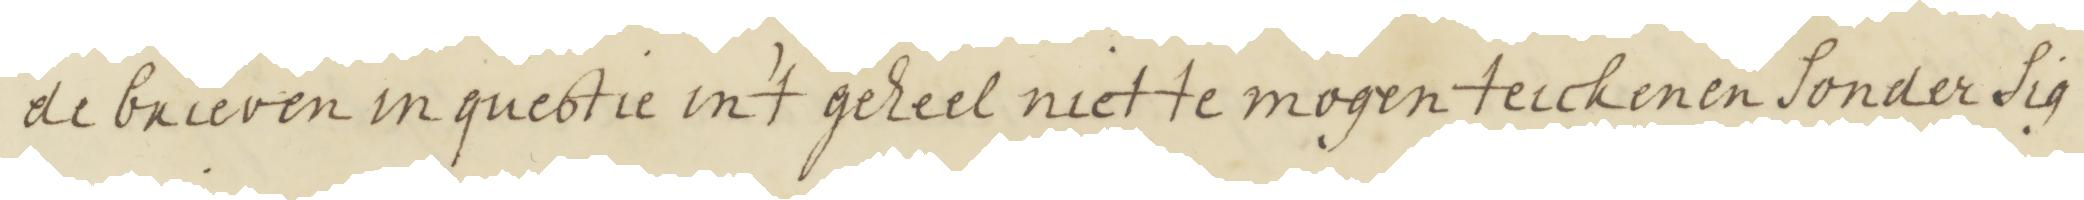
de brieven in questie in’t geheel niet te mogen teickenen sonder sig
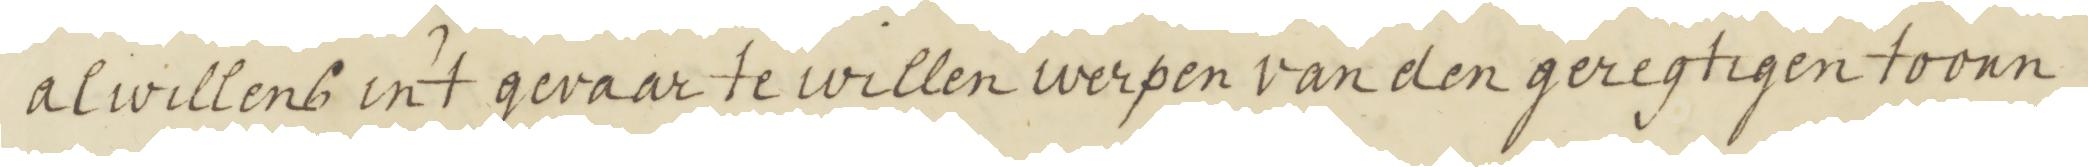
alwillens in’t gevaar te willen werpen van den geregtigen toorn
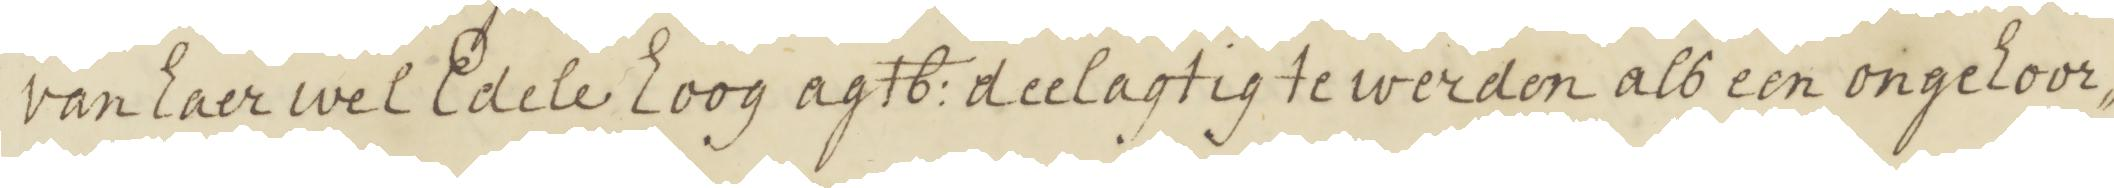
van haer wel Edele hoog agtb: deelagtig te werden als een ongehoor„
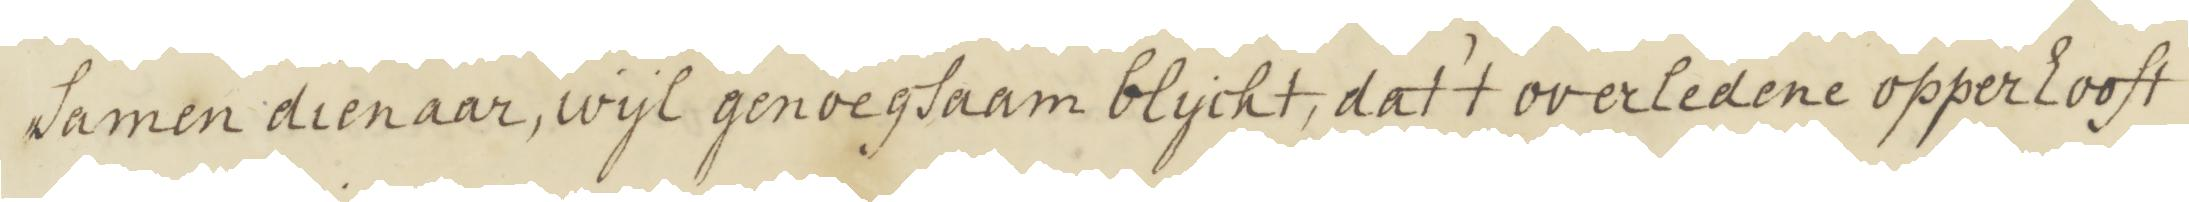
samen dienaar, wijl genoegsaam blijckt, dat ’t overledene opperhooft
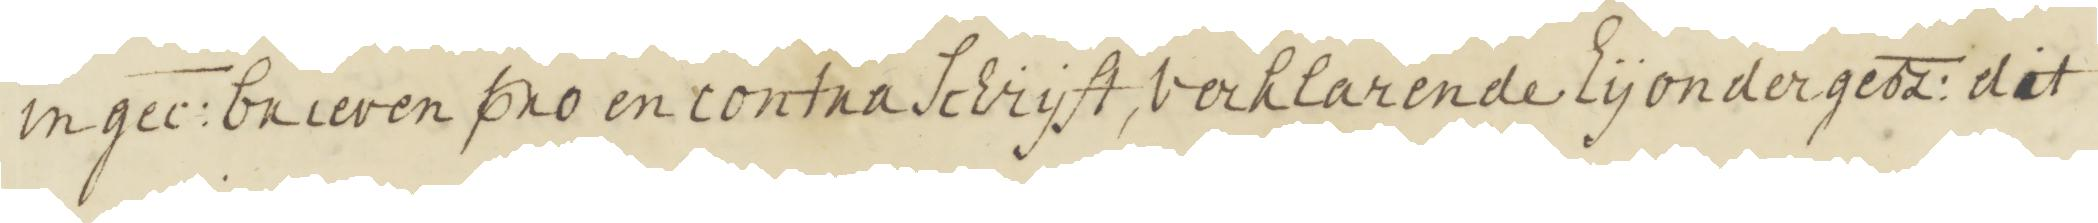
in gec:brieven pro en contra schrijft, verklarende hij ondergesz: dit
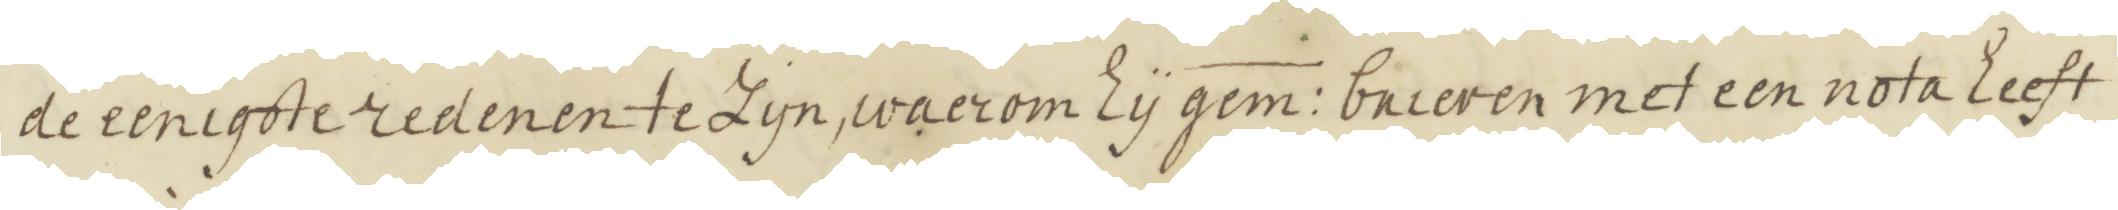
de eenigste redenen te zijn, waerom hij gem: brieven met een nota heeft
